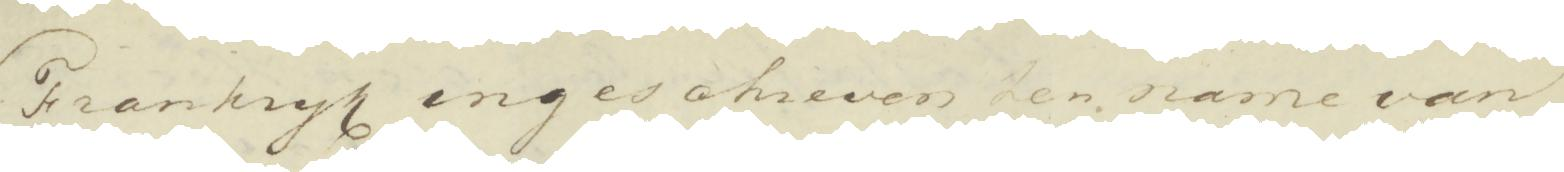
Frankryk ingeschreven ten name van
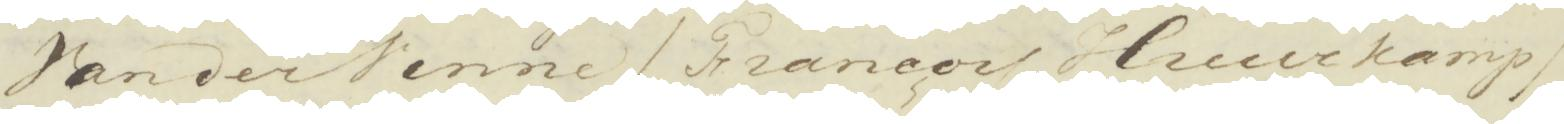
Van der Vinne/ François Huurkamp/
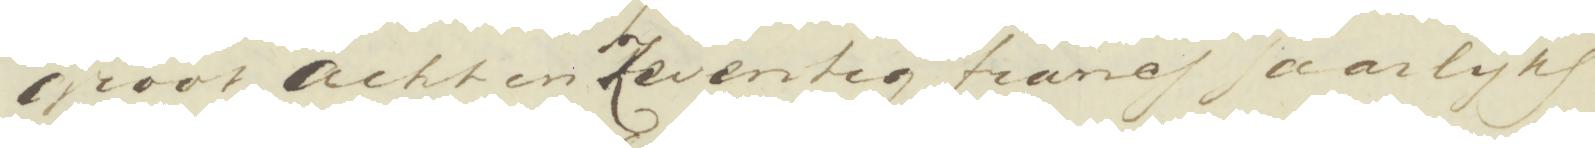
groot Acht en Zeventig francs jaarlyks
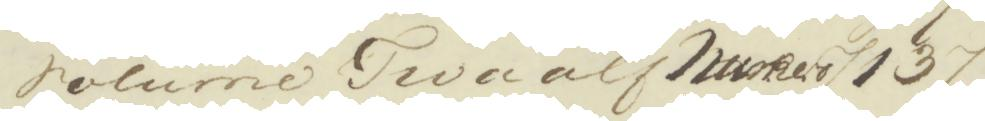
Volume Twaalf Numero 7137
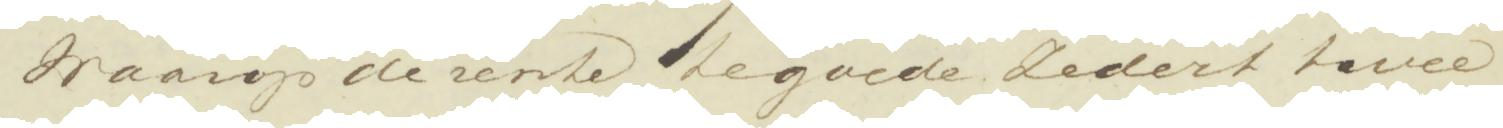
waarop de rente tegoede zedert twee
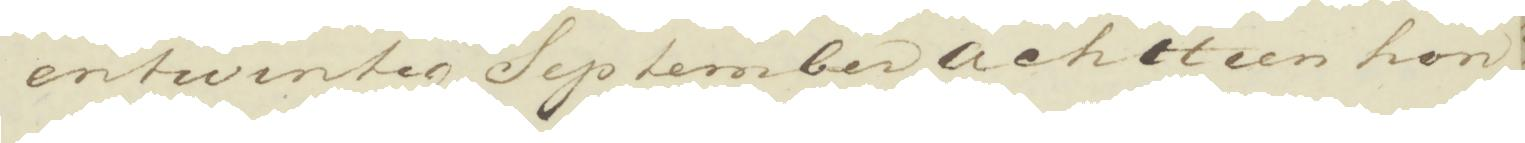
entwintig September achttien hon
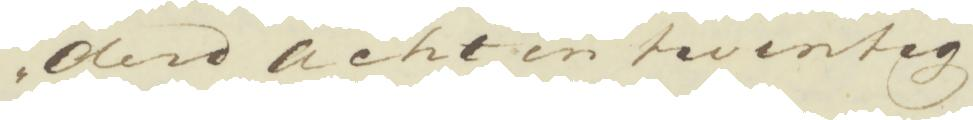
„derd acht en twintig
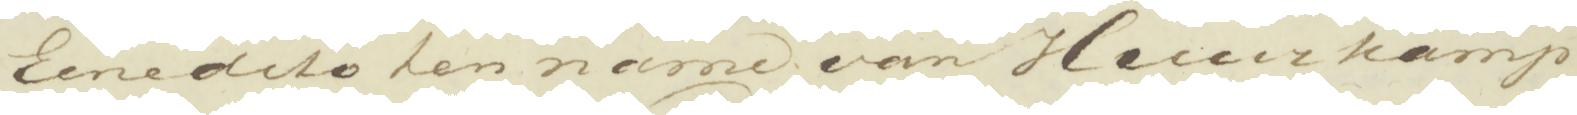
Eene dito ten name van Huurkamp
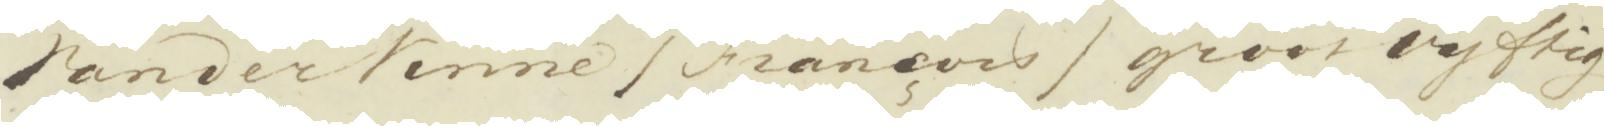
van der Vinne / François / groot vyftig
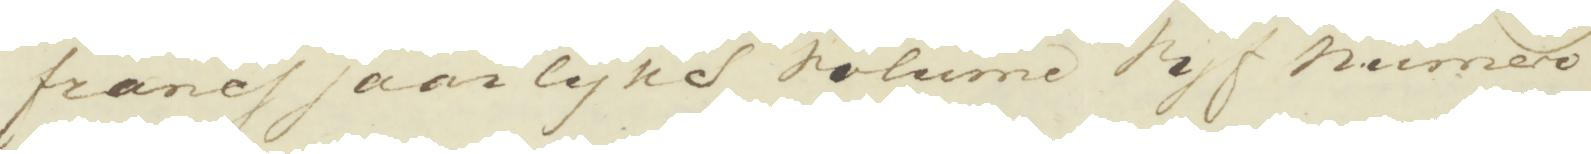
francs jaarlyks Volume Vyf Numero
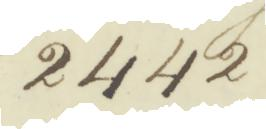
2442
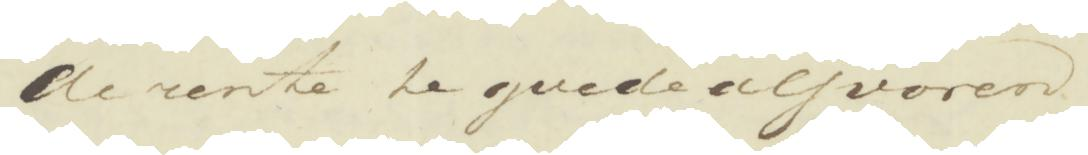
De rente te goede als voren
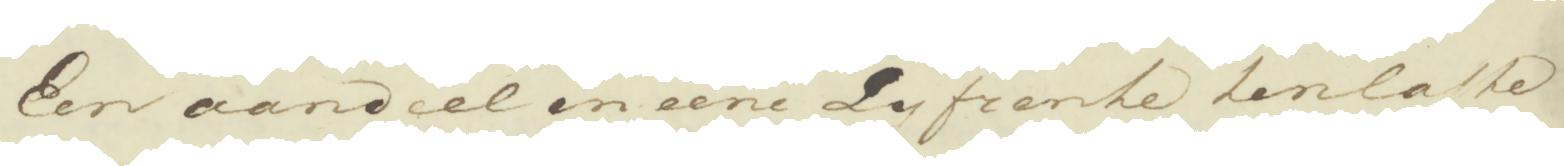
Een aandeel in eene Lyfrente tenlaste
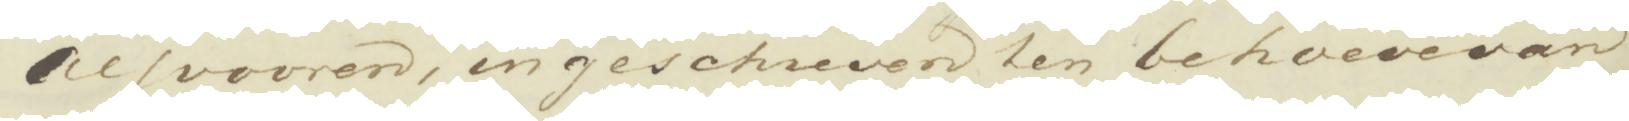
alsvooren, ingeschreven ten behoevevan
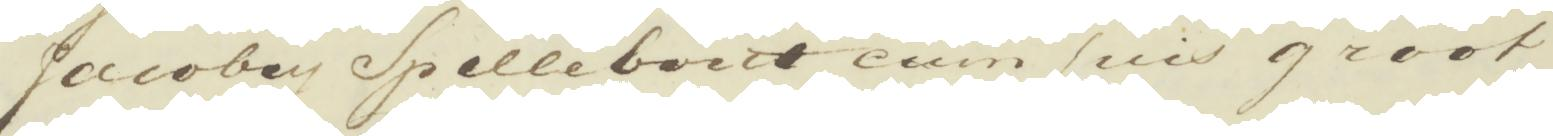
Jacobus Spillebout cum suis groot
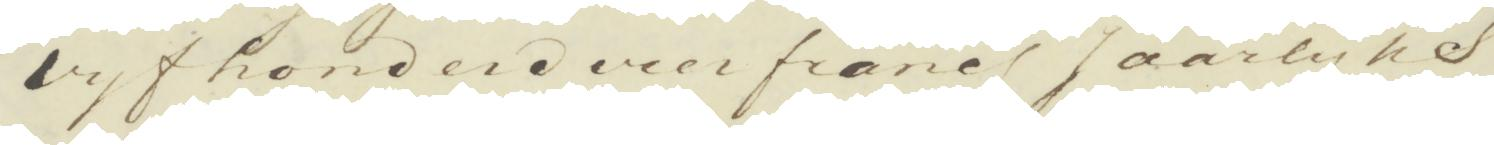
vyf honderd vier francs Jaarlyks
